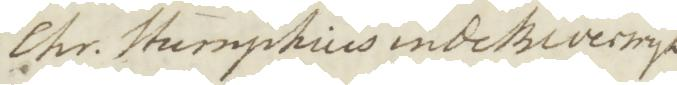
Chr. Stumphius in de Beverwyk
